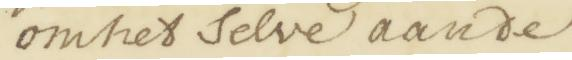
om het selve aan de
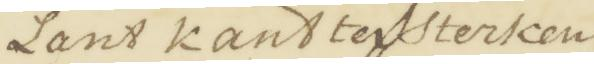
Lant kant te versterken
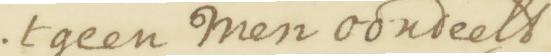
.t geen men oordeelt
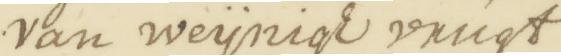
van weijnigh vrugt
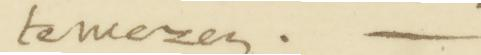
tewezen. —
